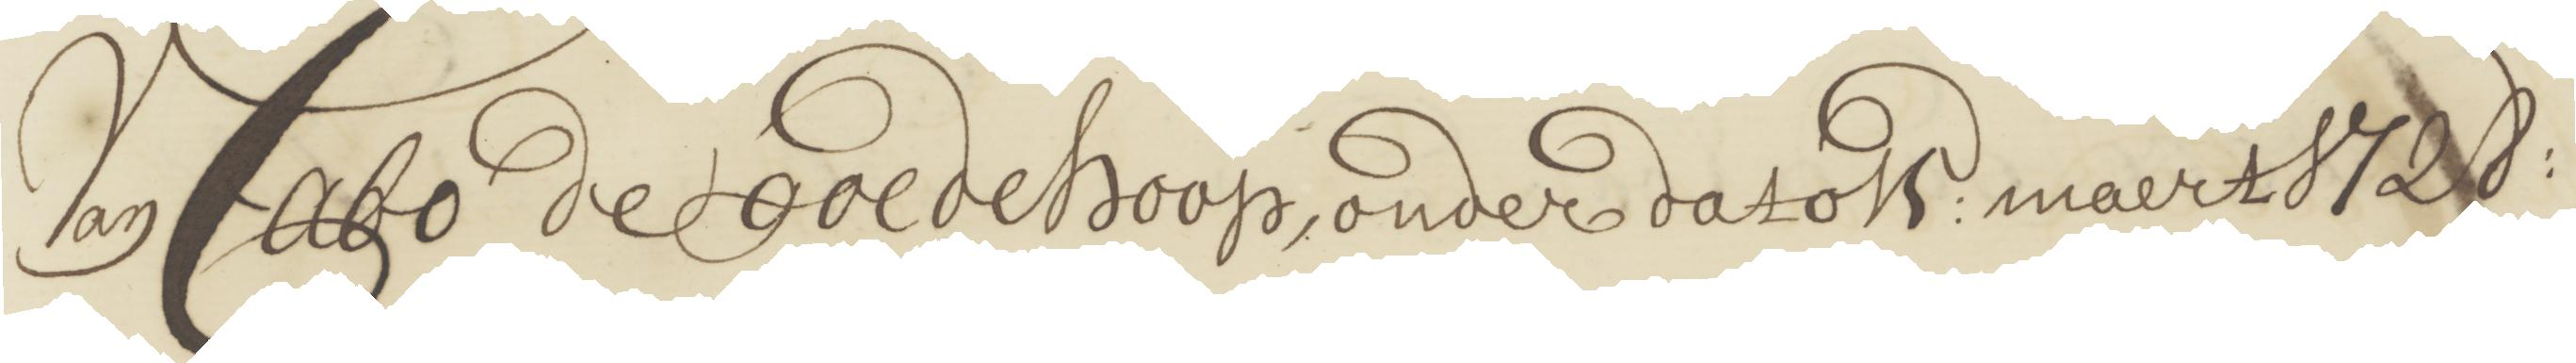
Van Cabo de goede hoop, onder dato 15:' maert 1728:
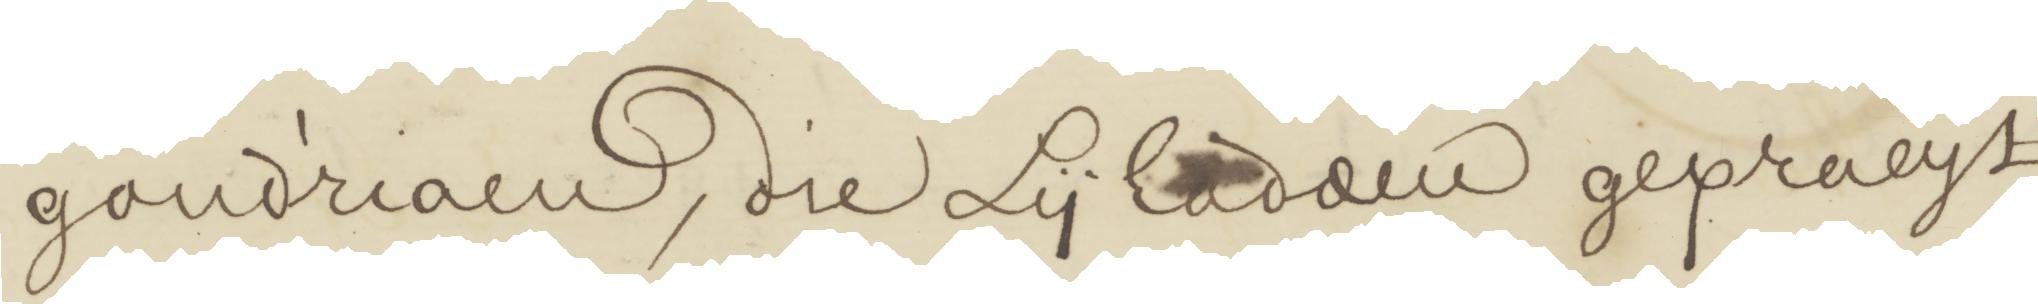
goudriaen, die sij hadden gepraeijt
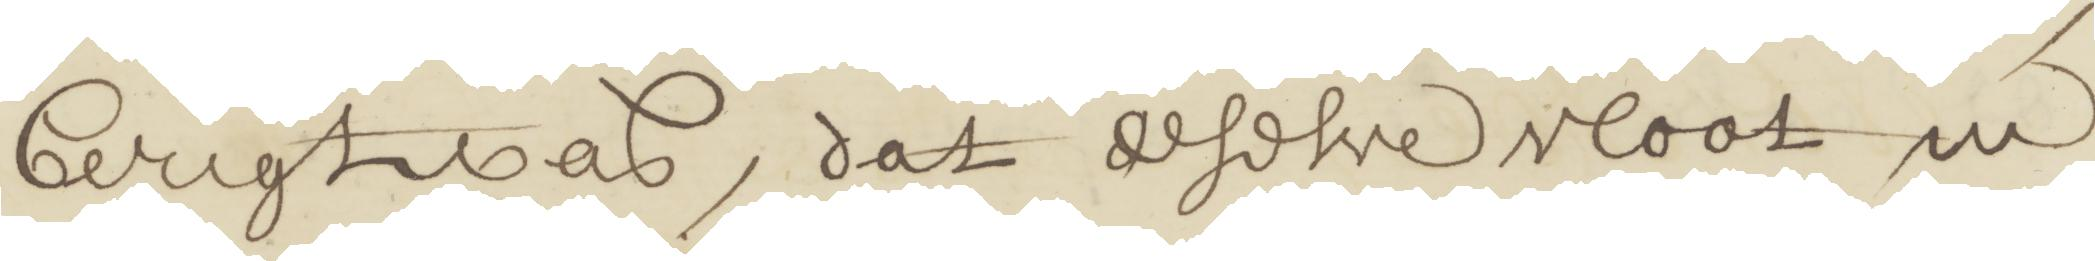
berigt was, dat deselve vloot in
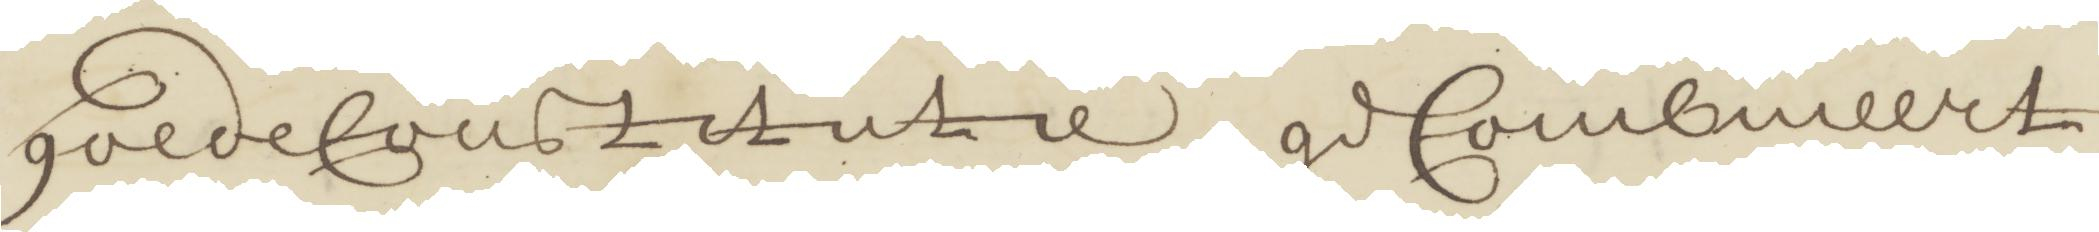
goede constitutie gecombineert
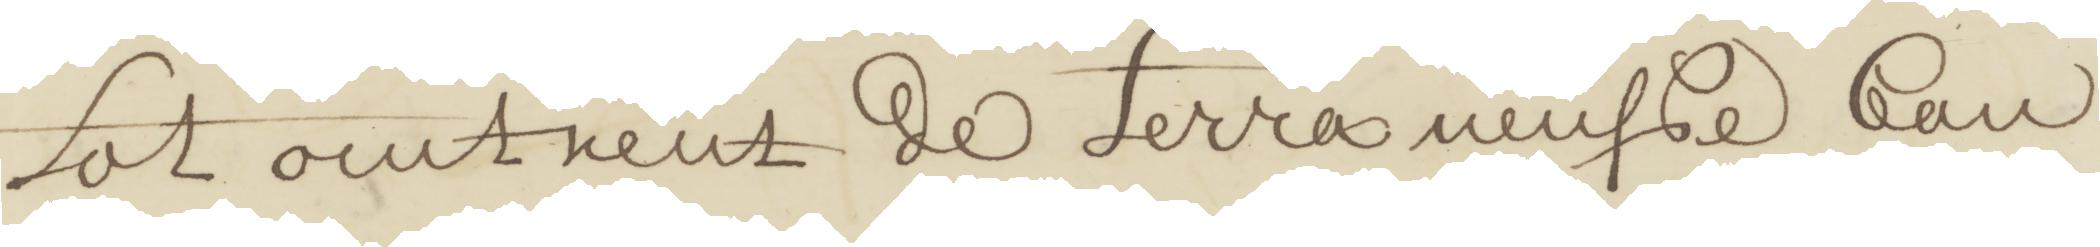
tot omtrent de terra neufse ban
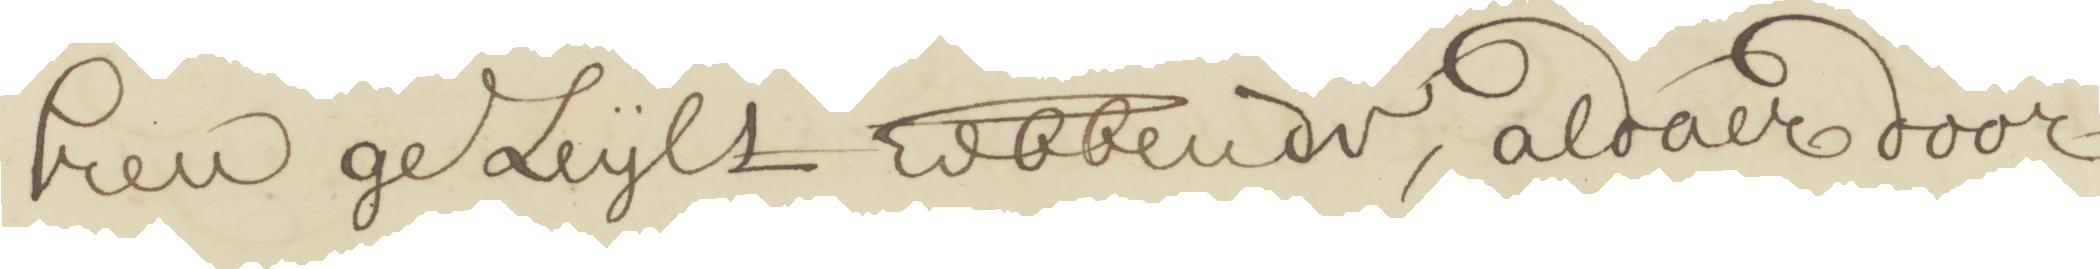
ken gezeijlt hebbende, aldaer door
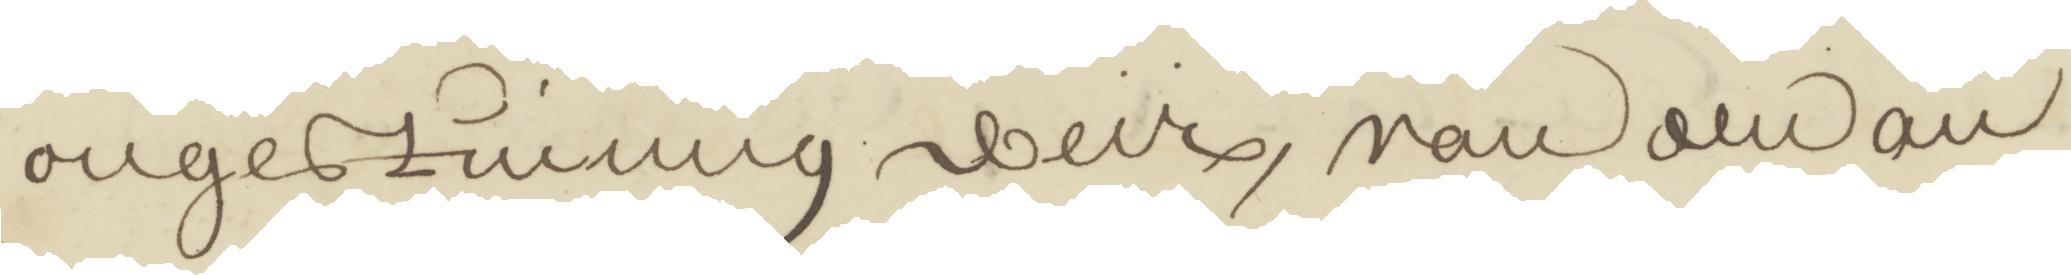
ongestuimig weir, van den an
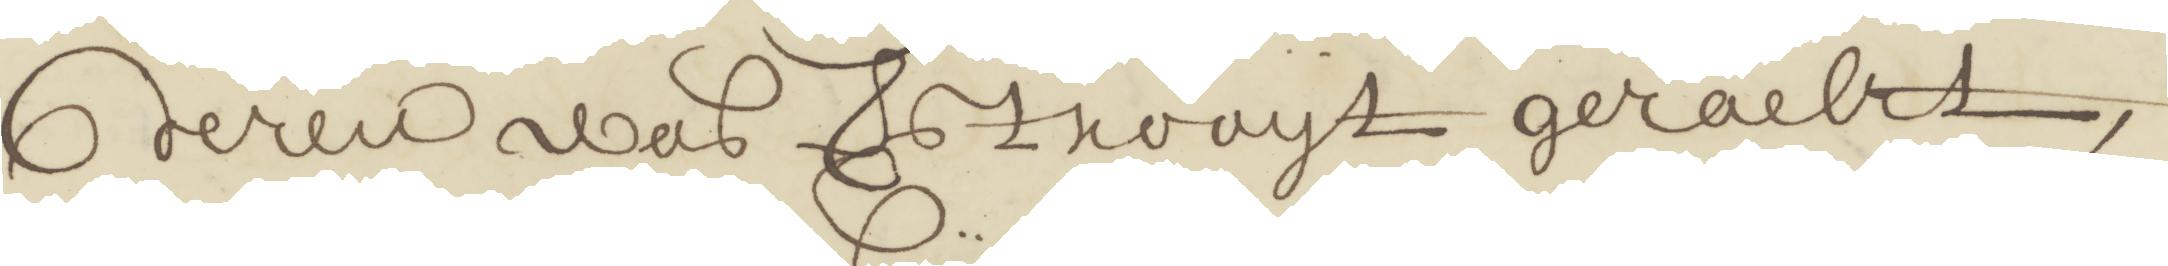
deren was verstrooijt geraekt,
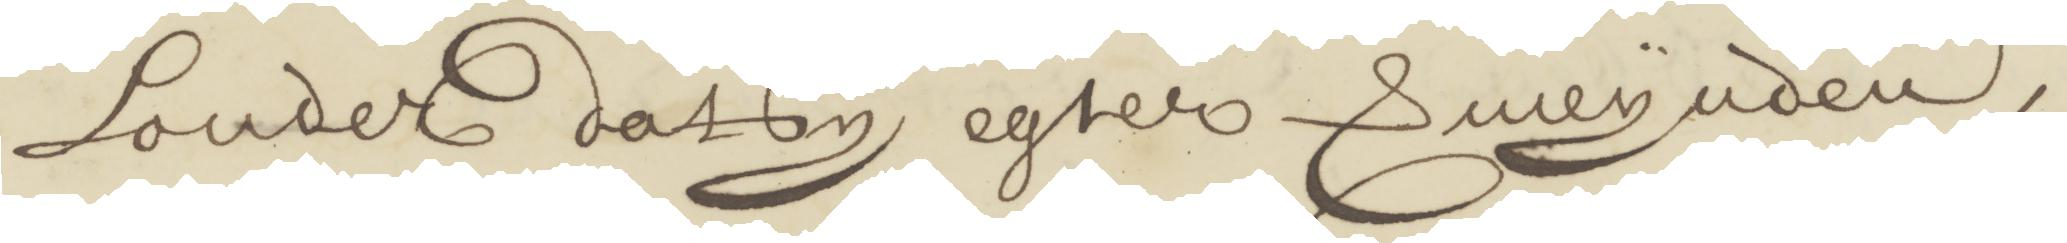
sonder dat sij egter vermeijnden,
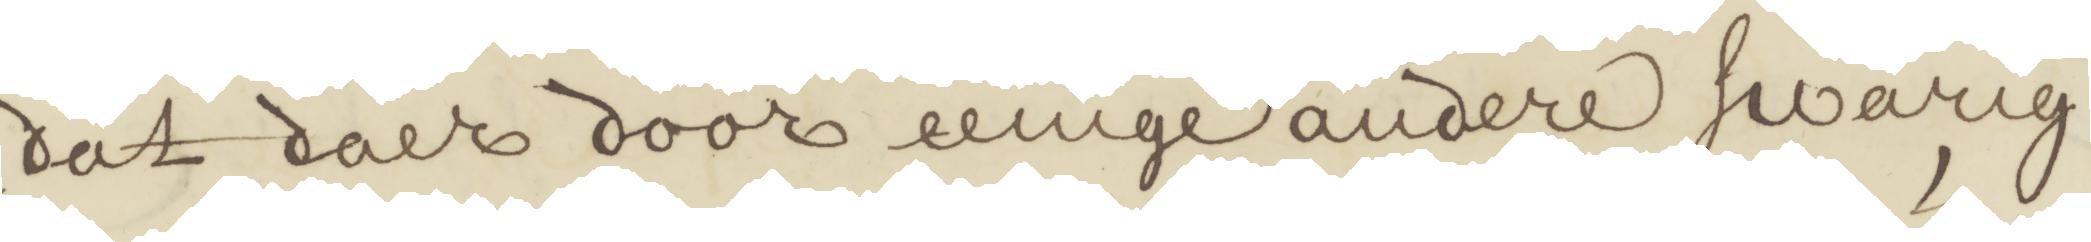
dat daer door eenige andere swarig
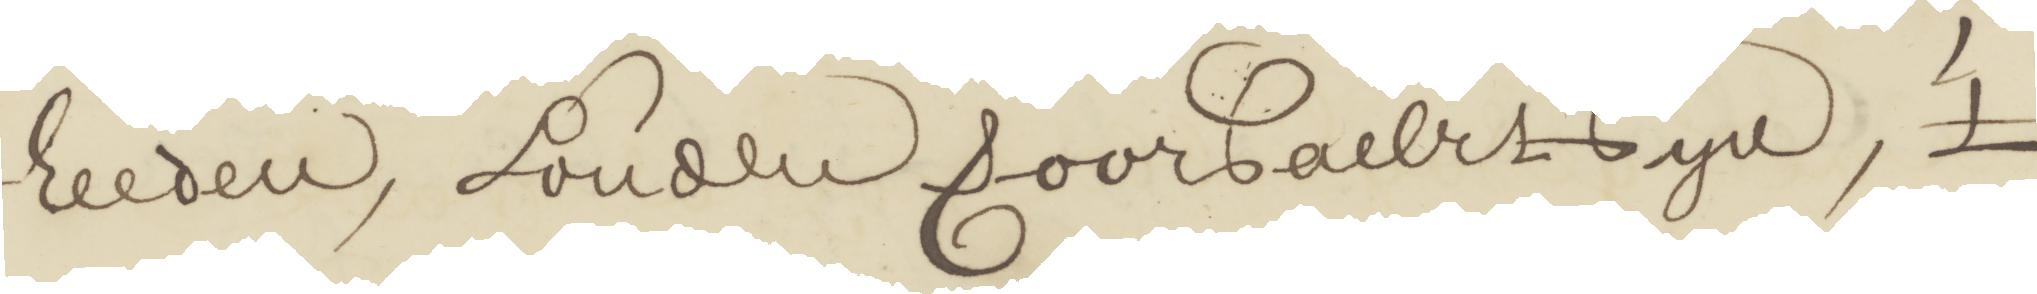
heeden, souden veroorsaekt sijn, ’t
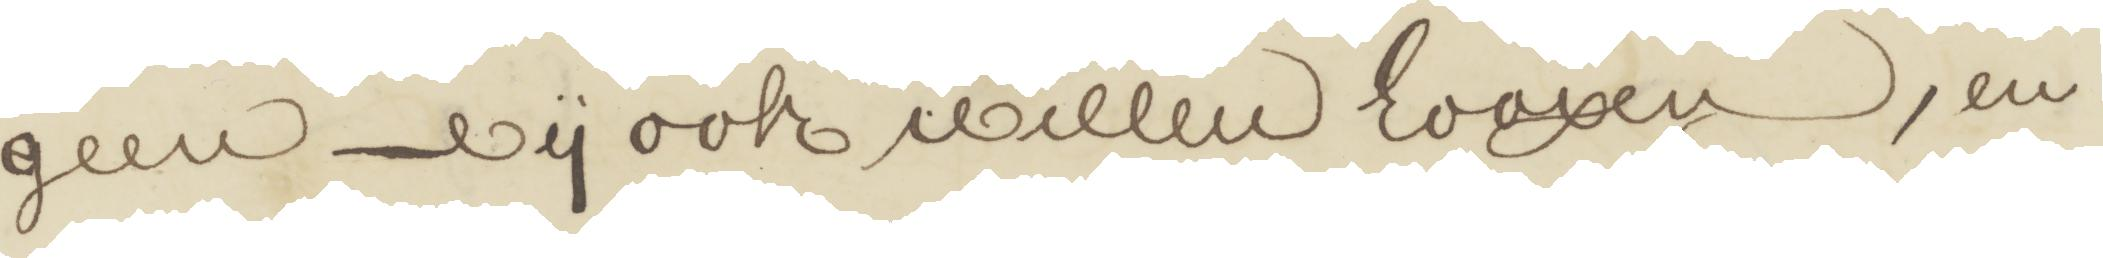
geen wij ook willen hoopen, en
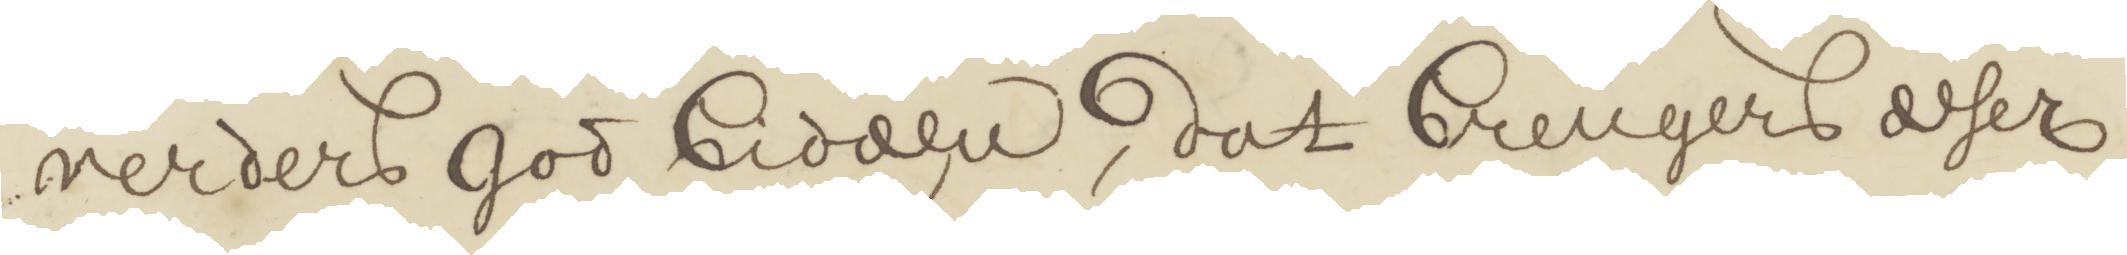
verders god bidden, dat brengers deser
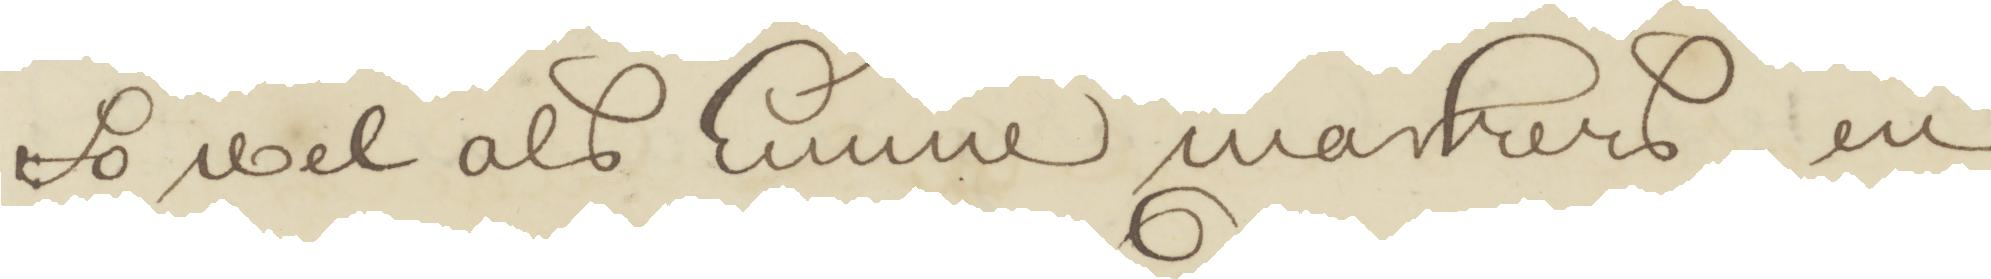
so wel als hunne mackers, en
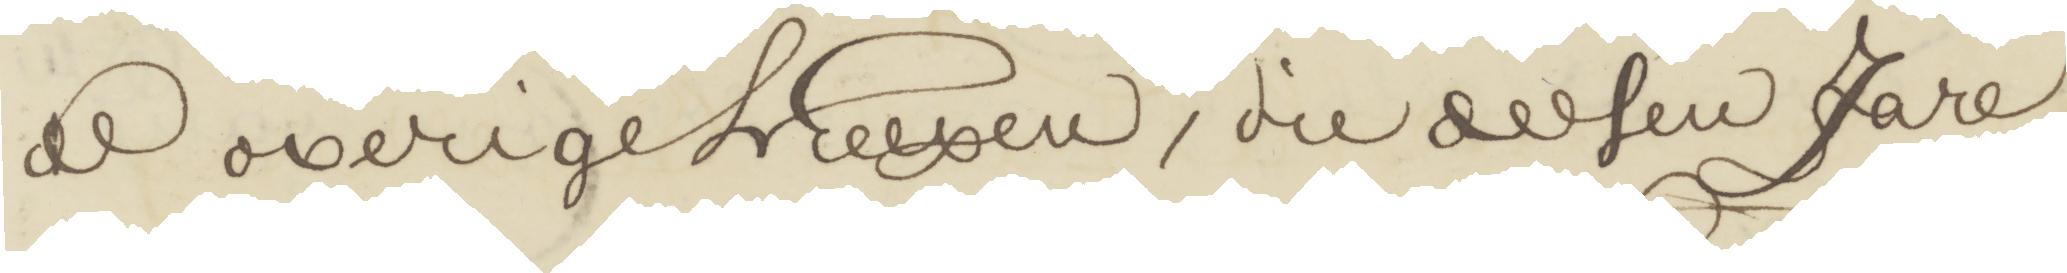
de overige scheepen, die deesen Jare
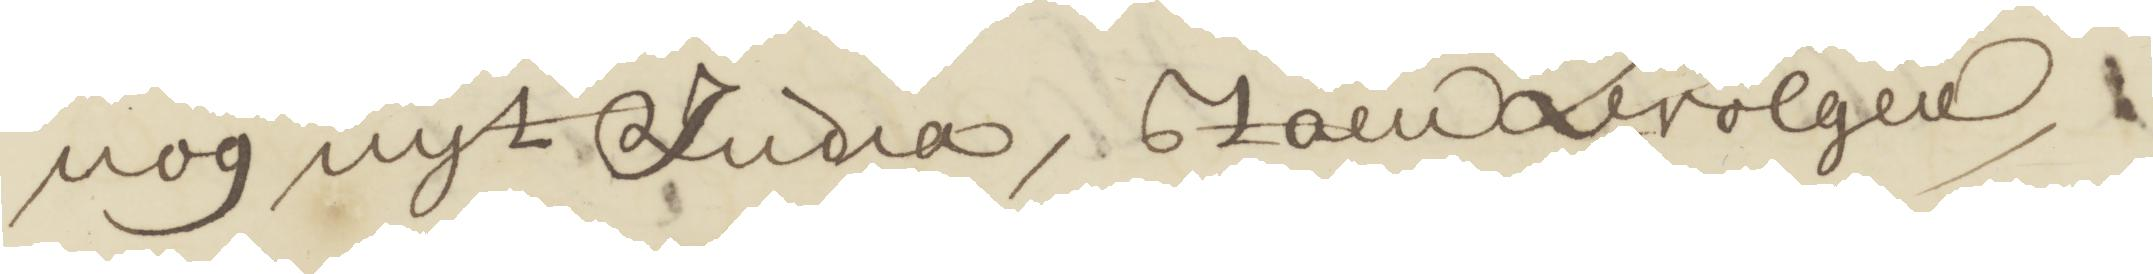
nog uijt India, staen tevolgen,
